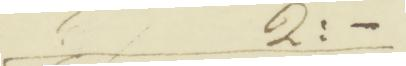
„ 2: -
